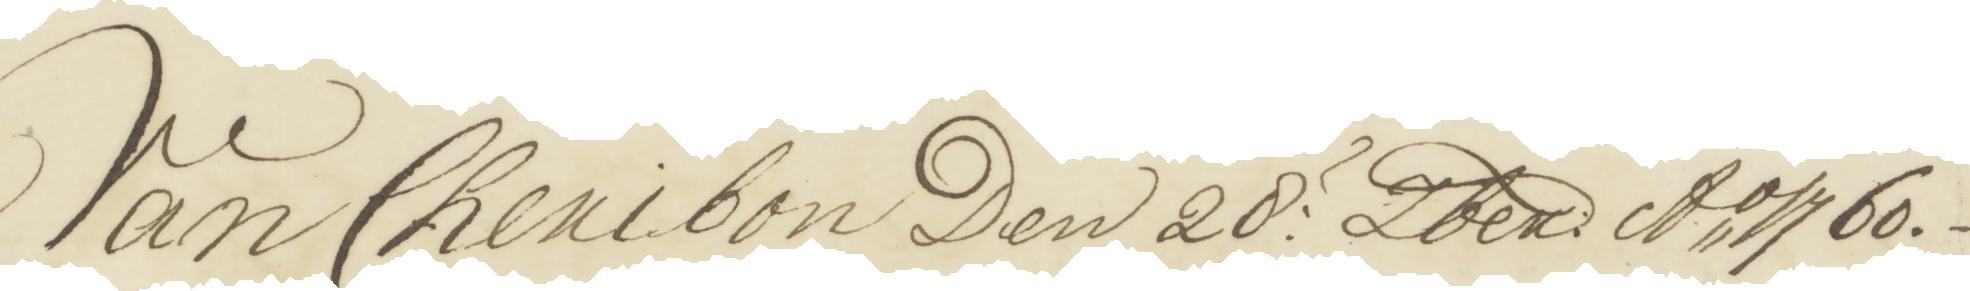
Van Cheribon Den 28:' 7ber: A„o 1760.
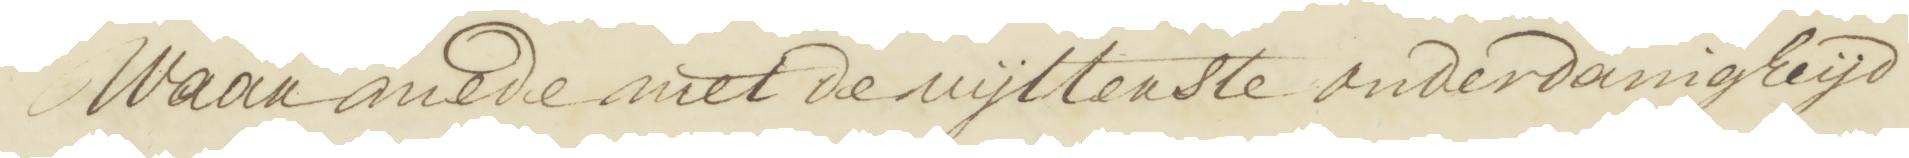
Waar mede met de uijtterste onderdanigheijd
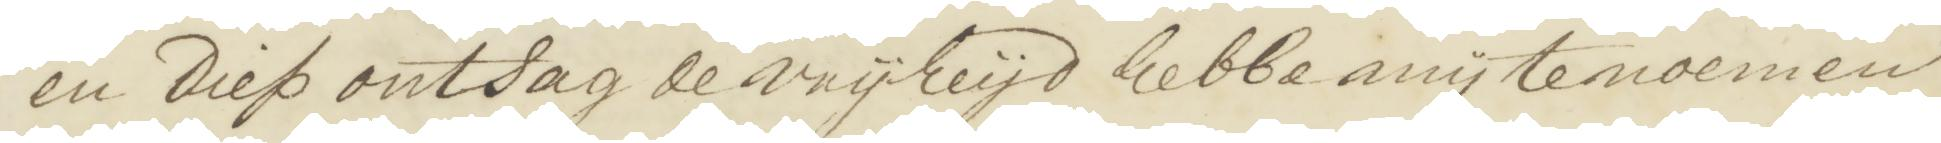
en diep ontsag de vrijheijd hebbe mij te noemen
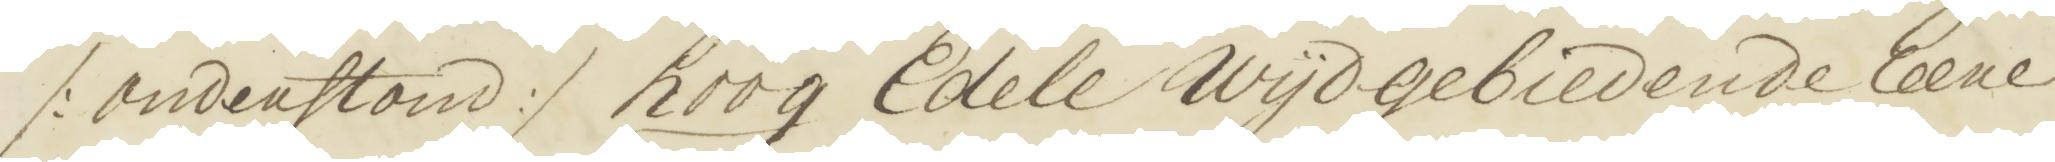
/:onderstond:/ hoog Edele wijd gebiedende heere
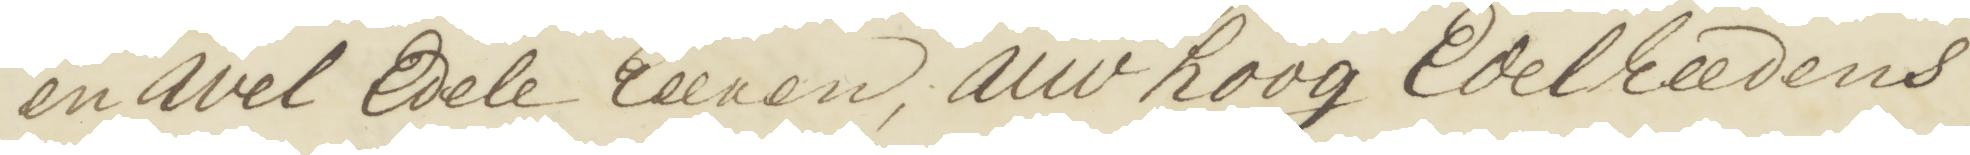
en wel Edele heeren, uw hoog Edelheedens
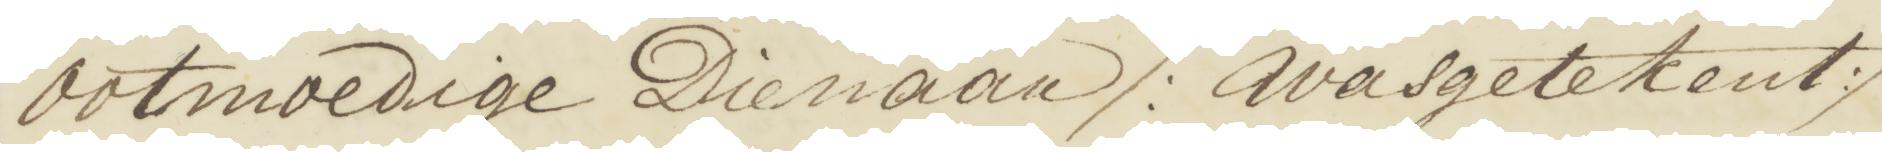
ootmoedige Dienaar /:was getekent:/
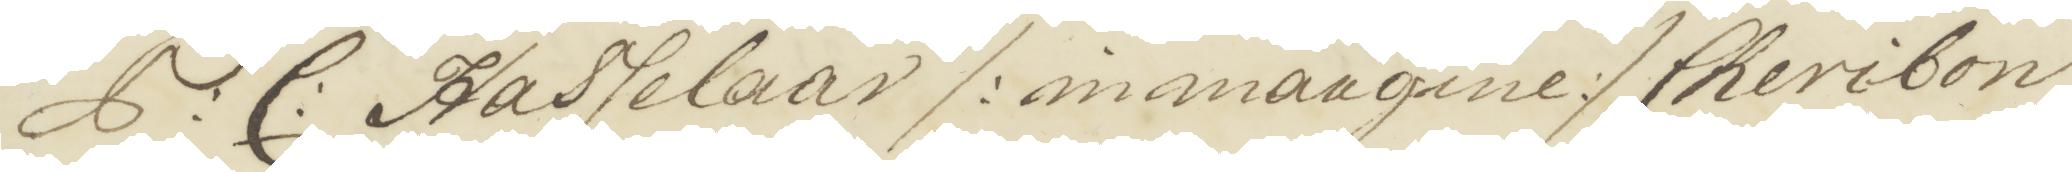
P: C: Hasselaar /:in margine:/ Cheribon
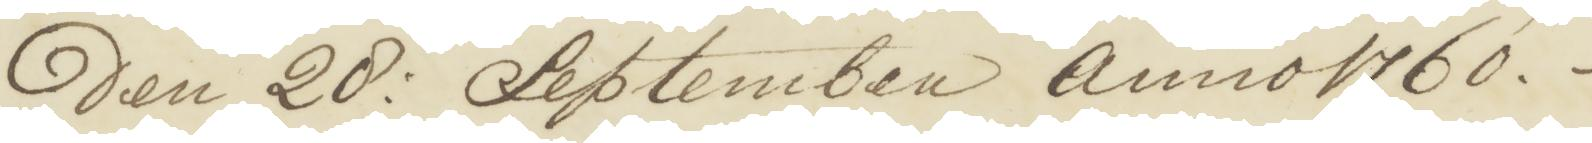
den 28:' September Anno 1760.
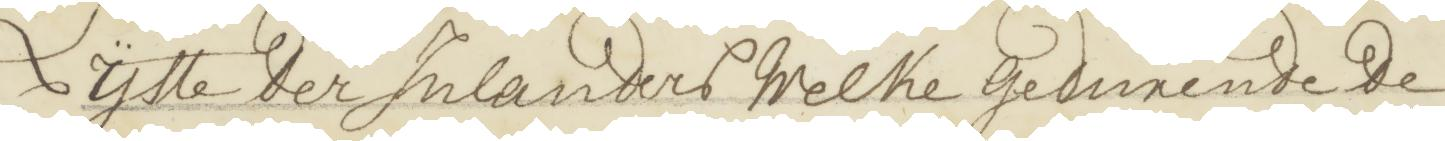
Lijste der Jnlanders welke gedurende de
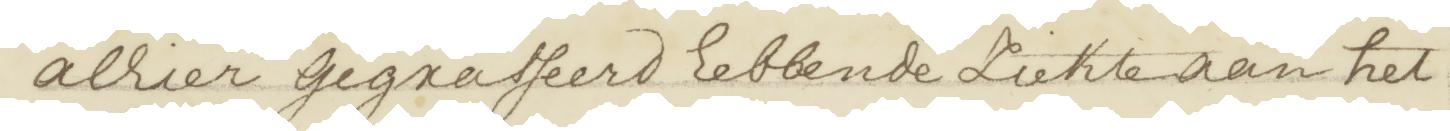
alhier gegrasseerd hebbende ziekte aan het
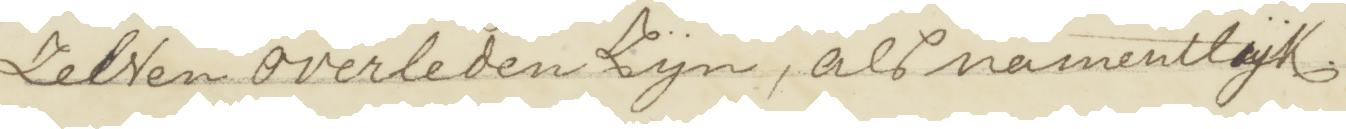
zelven overleden zijn, als namentlijk.
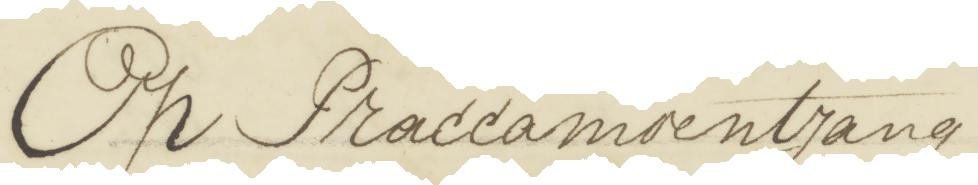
Op Praccamoentjang
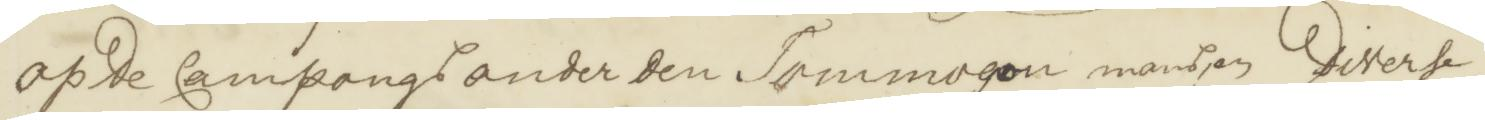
op de Campongs onder den Tommogon mans, en Diverse
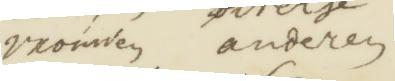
vrouwen anderen
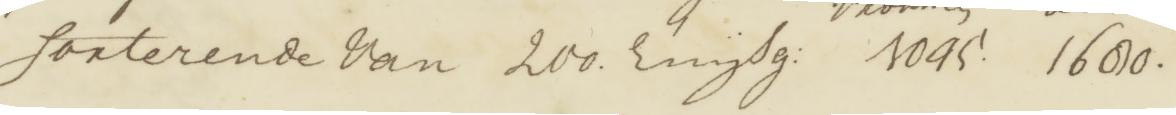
sorterende van 200. huijsg: 1045. 1680.
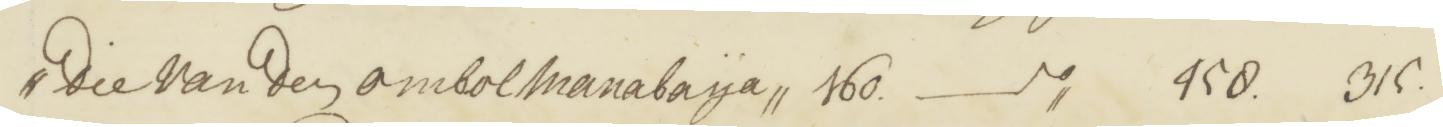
„ die van den ombol manabaija „ 160. _„o 458. 315.
